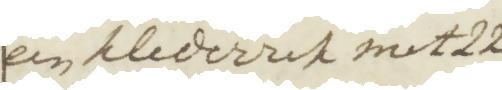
een klederrek met 22
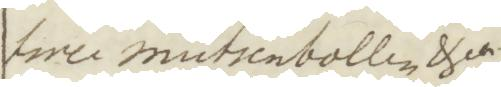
twee mutsenbollen &ca
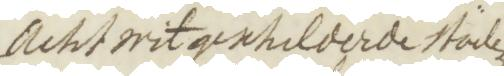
Acht wit geschilderde stoelen
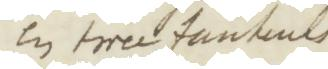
en twee fauteuls
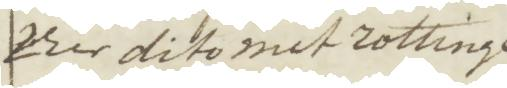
Vier dito met rottinge
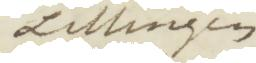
Zittingen
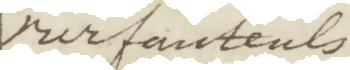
vier fauteuls
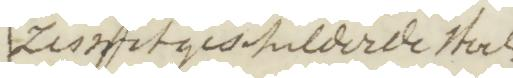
Zes wit geschilderde stoelen
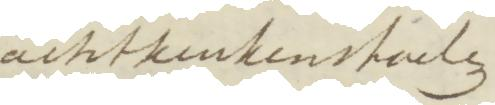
acht keukenstoelen
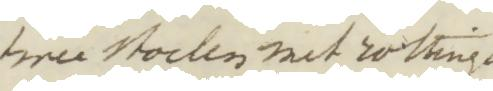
twee stoelen met rottinge
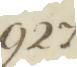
927
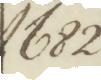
ƒ682
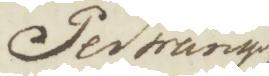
Per transp
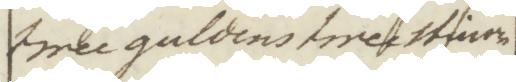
twee guldens twee stuiver
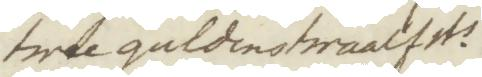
twee guldens twaalf st.s
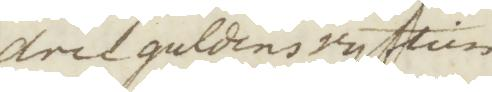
dwee guldens vijftien
